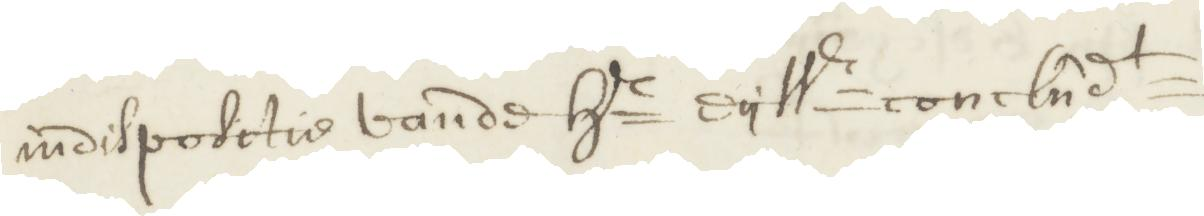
indispositie vande H=r Eijss=r conclud=t
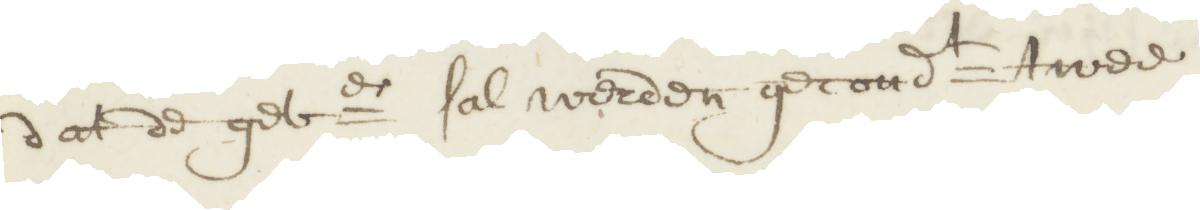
dat de gev=er sal werden gecond=t twee
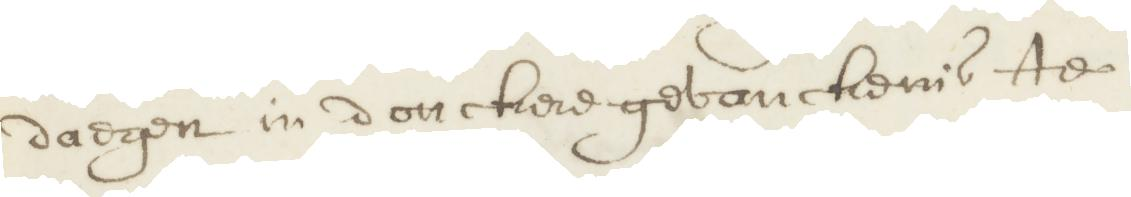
daegen in donckere gevanckenis te
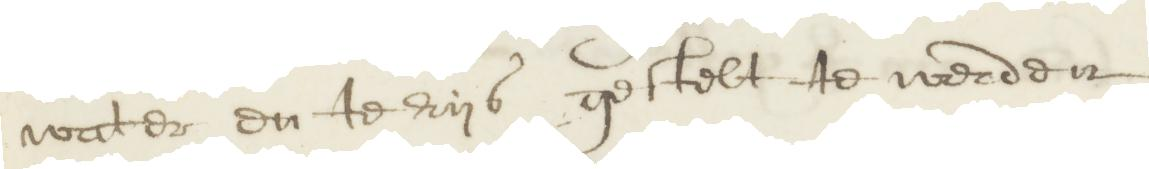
water en te rijs gestelt te werden
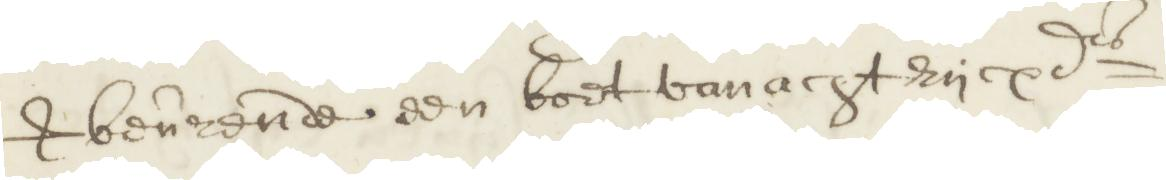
Verbeurende een boet van acht rijcxd=rs
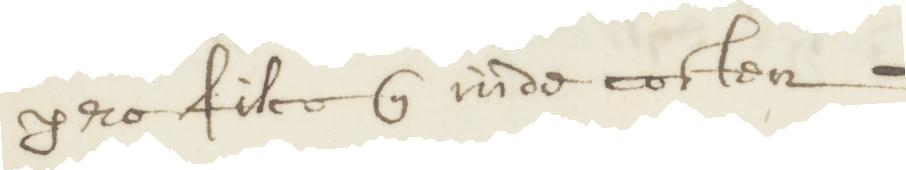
pro fisco ende inde costen
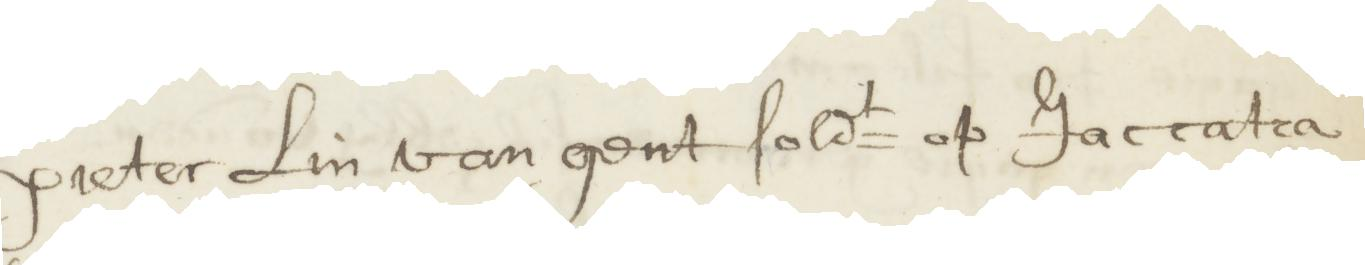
pieter Lin van gent sold=t op Jaccatra
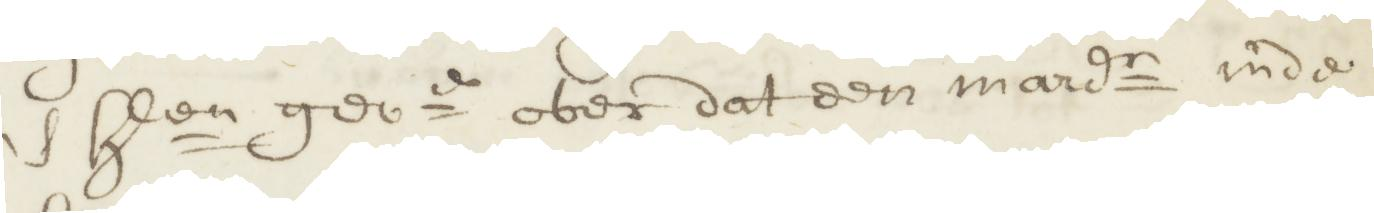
S h=en gev=e over dat een mard=r inde
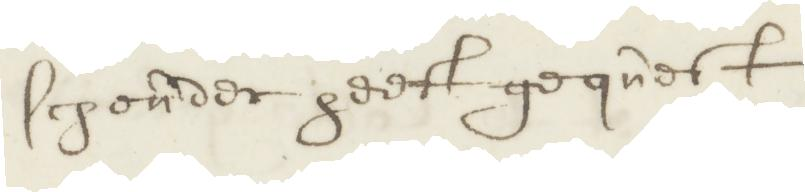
schouder heeft gequest
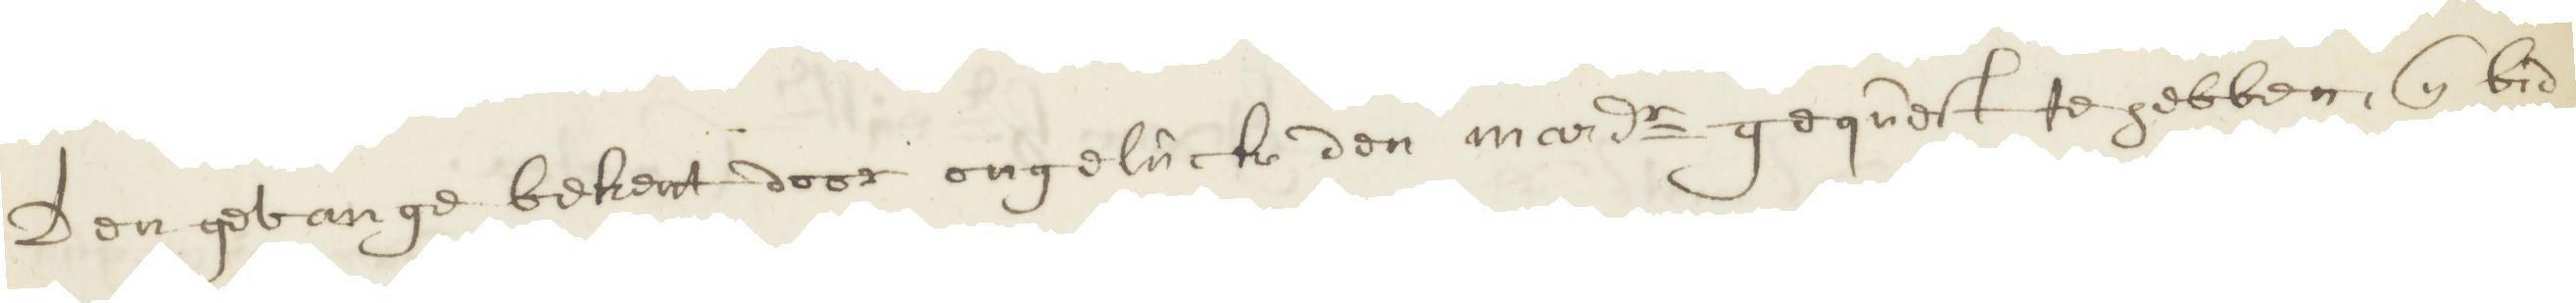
Den gevange bekent door ongeluck den mard=r gequest te hebben, ende bid
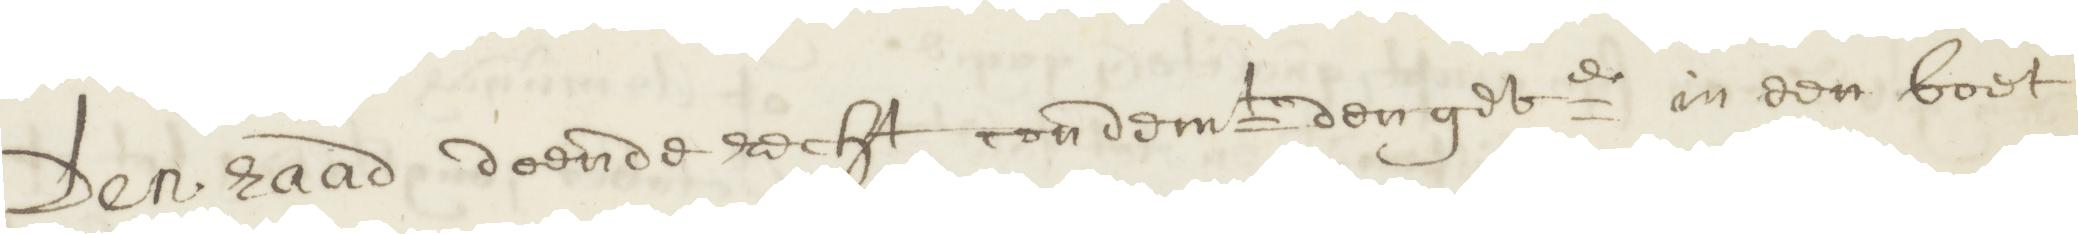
Den raad doende recht condem=t den gev=e in een boet
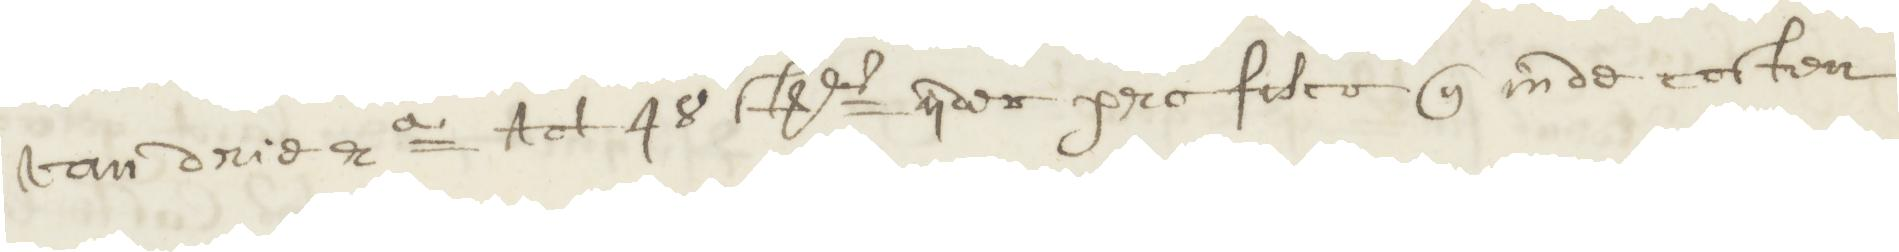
van drie r=a tot 48 stver=rs ijder pro fisco ende in de costen
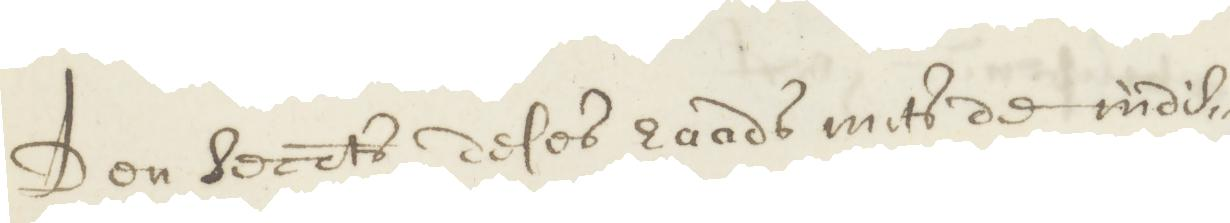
Den secrts deses raads mits de indis
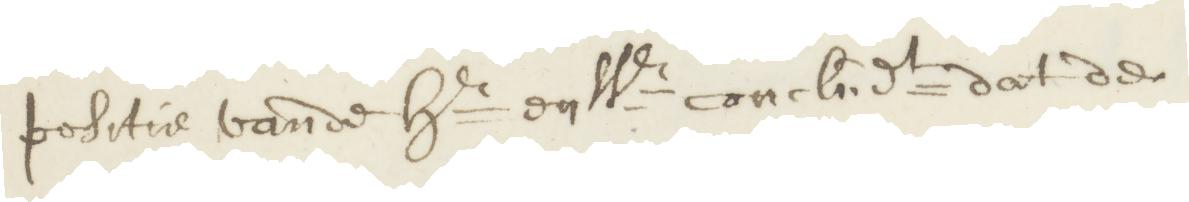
positie vande H=r eyss=r conclud=t dat de
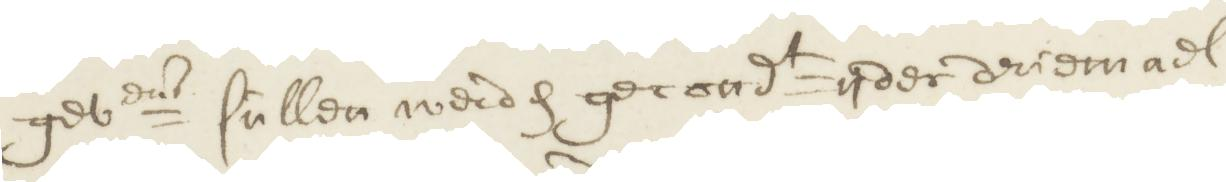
gev=ens sullen werden gecond=t yder driemael
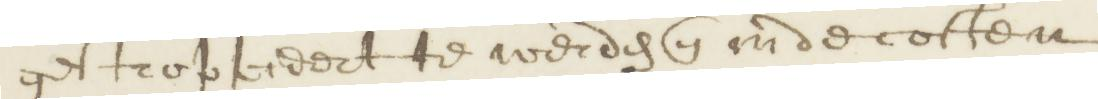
gestroppidert te werden ende in de costen
